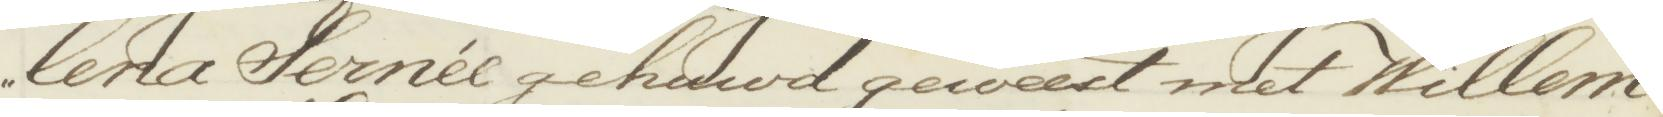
„lena Sernée gehuwd geweest met Willem
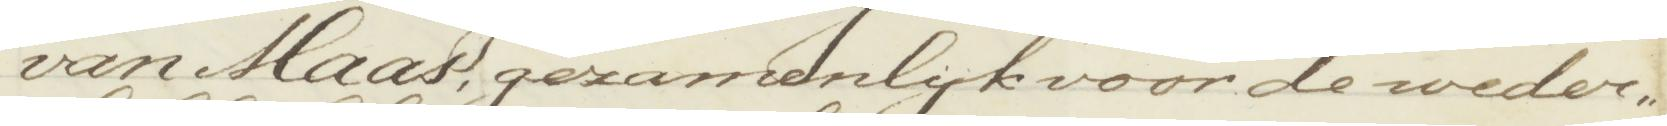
van Maas, gezamenlijk voor de weder„
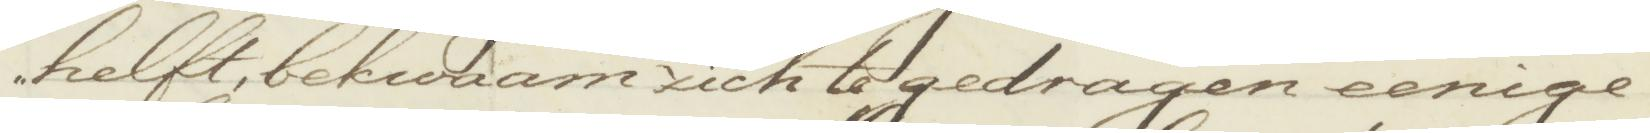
„helft, bekwaam zich te gedragen eenige
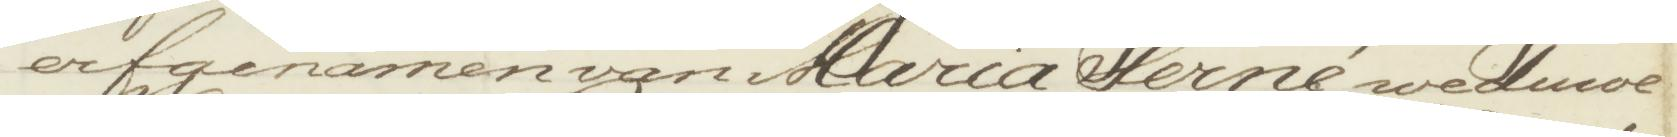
erfgenamen van Maria Serné weduwe
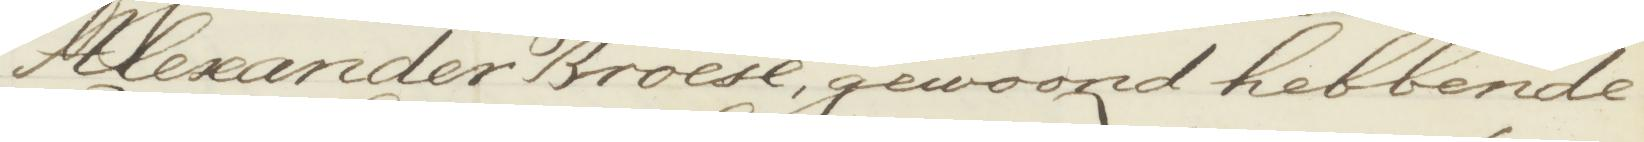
Alexander Broese, gewoond hebbende
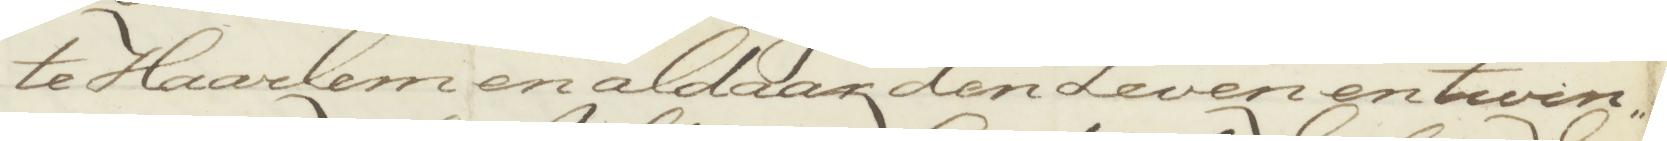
te Haarlem en aldaar den Zeven en twin„
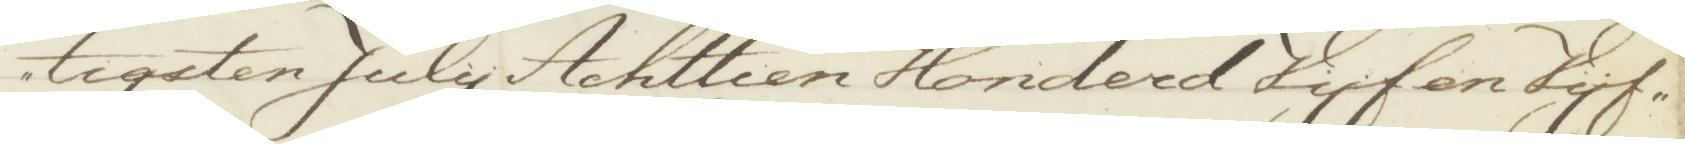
„tigsten Julij Achttien Honderd Vijf en Vijf„
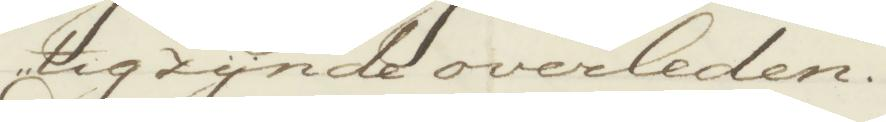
„tig zijnde overleden.
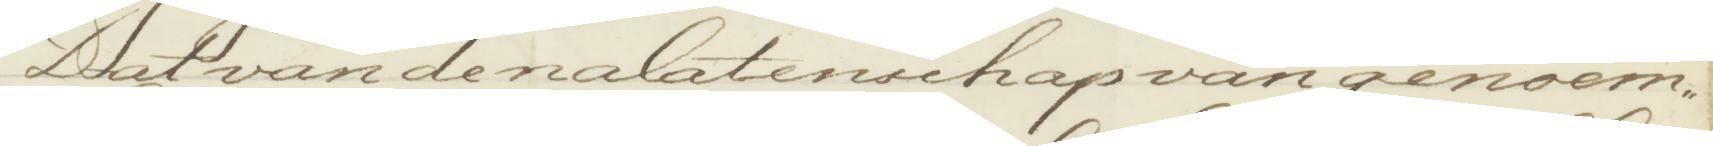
Dat van de nalatenschap van genoem„
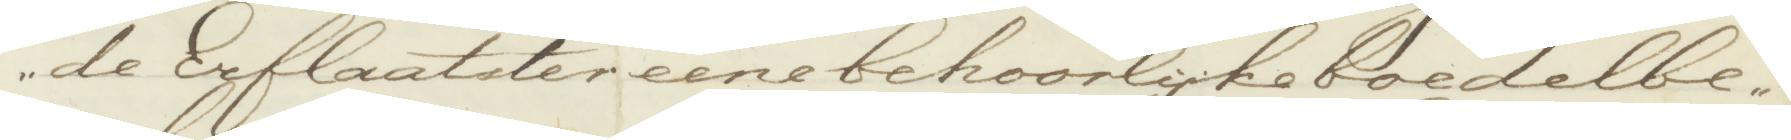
„de Erflaatster eene behoorlijke boedelbe„
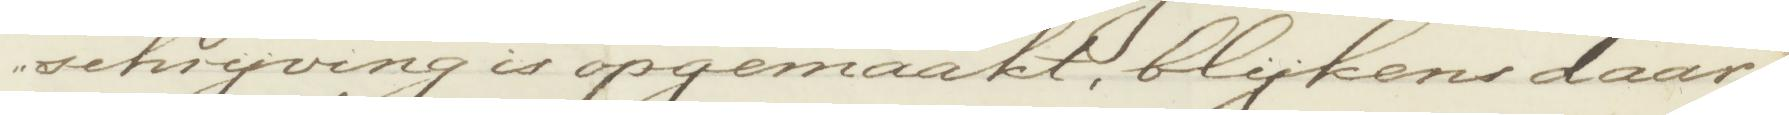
„schrijving is opgemaakt, blijkens daar
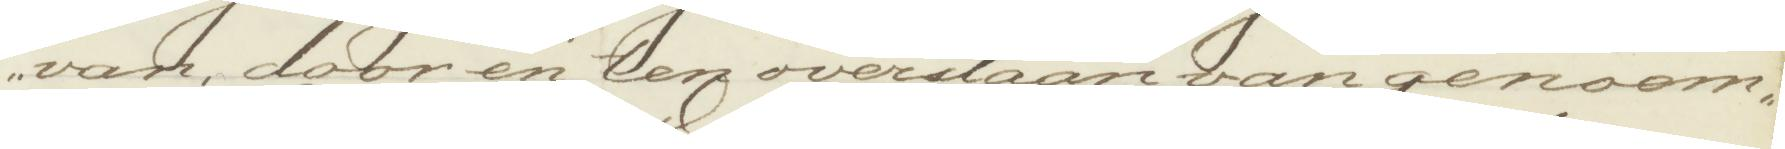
„van, door en ten overstaan van genoem„
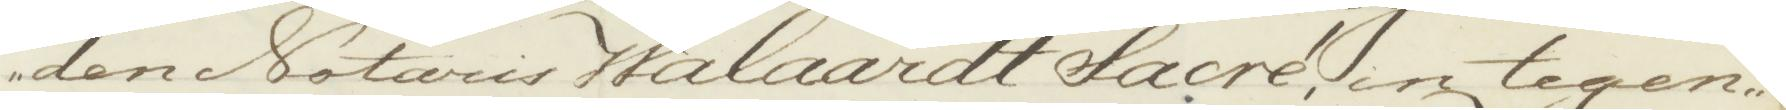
„den Notaris Walaardt Sacré, in tegen„
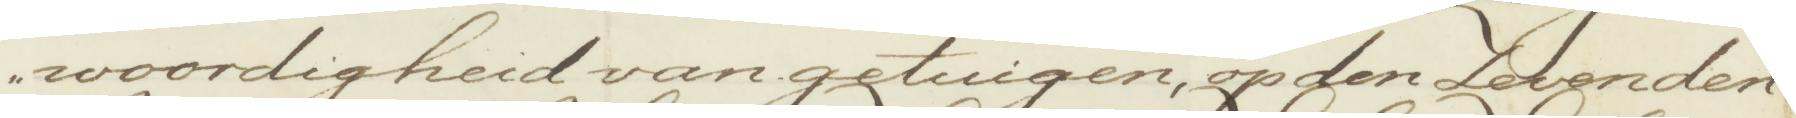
„woordigheid van getuigen, op den Zevenden
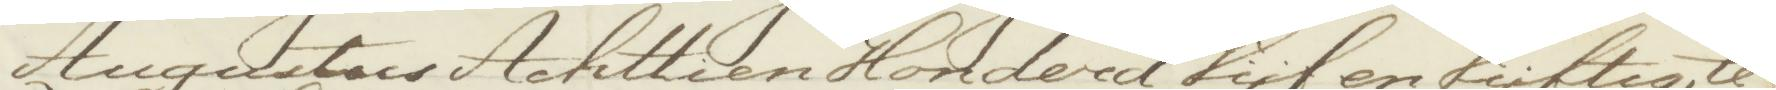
Augustus Achttien Honderd Vijf en Vijftig, te
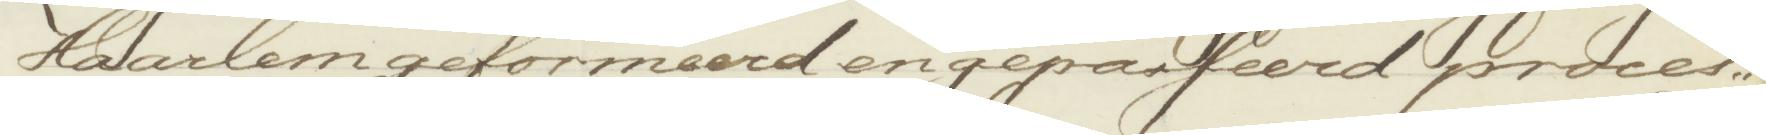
Haarlem geformeerd en gepasseerd proces„
